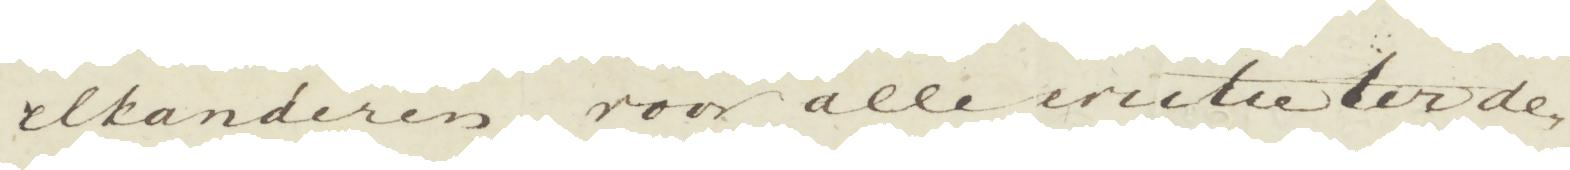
elkanderen voor alle evictie ter de,
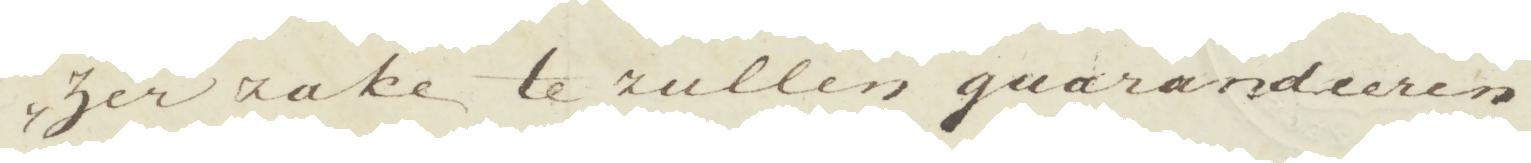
„zer zake te zullen guarandeeren
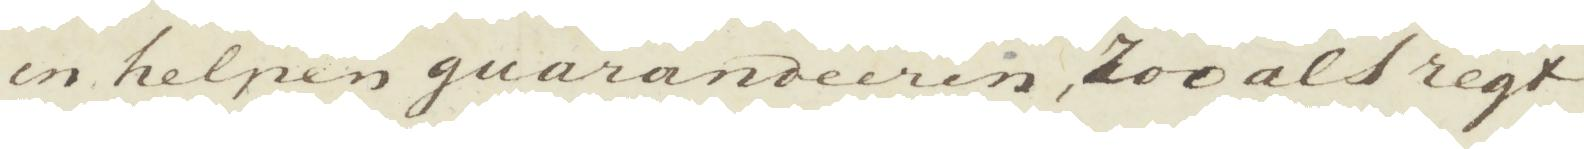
en helpen guarandeeren, Zoo als regt
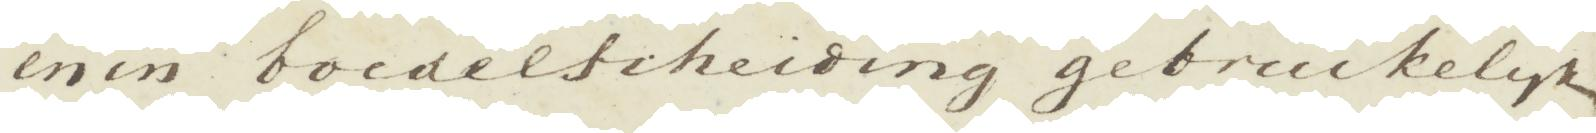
en in boedelscheiding gebruikelyk
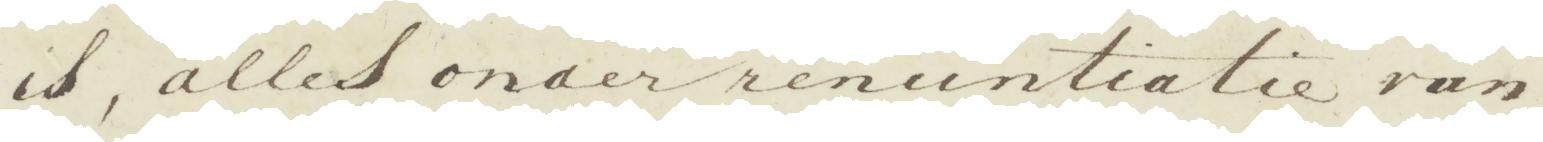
is, alles onder renuntiatie van
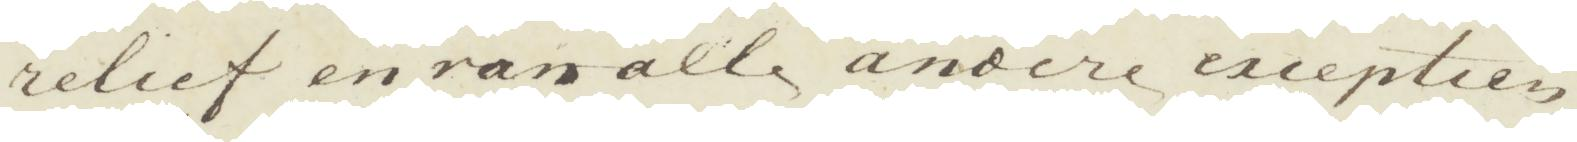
relief en van alle andere exceptien
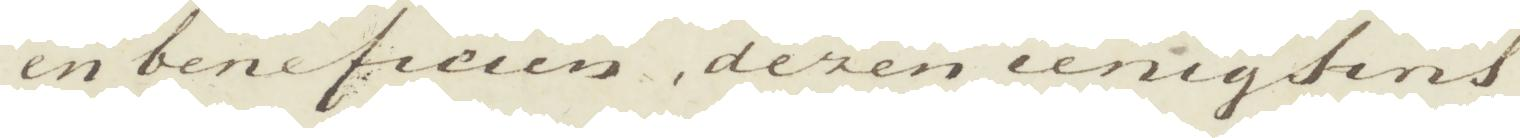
en beneficien, dezen eenigsins
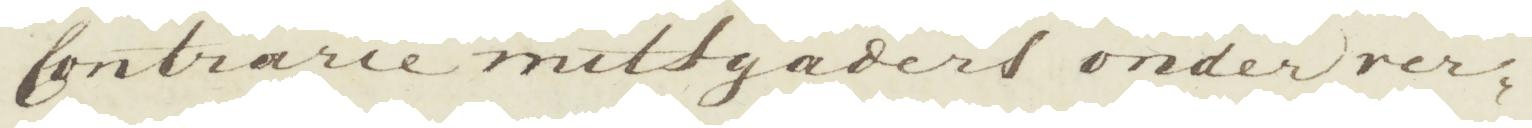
Contrarie mitsgaders onder ver„
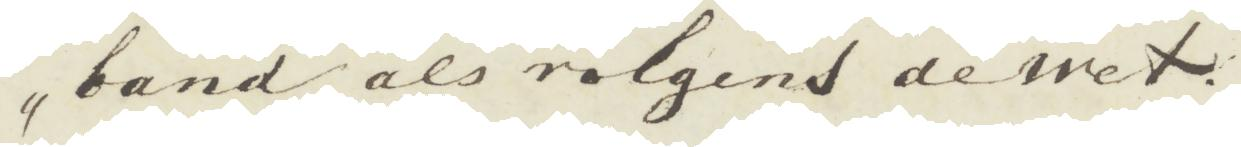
„band als volgens de wet.
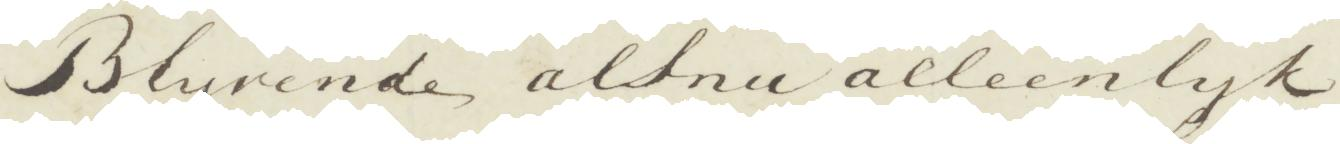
Blyvende als nu alleenlyk
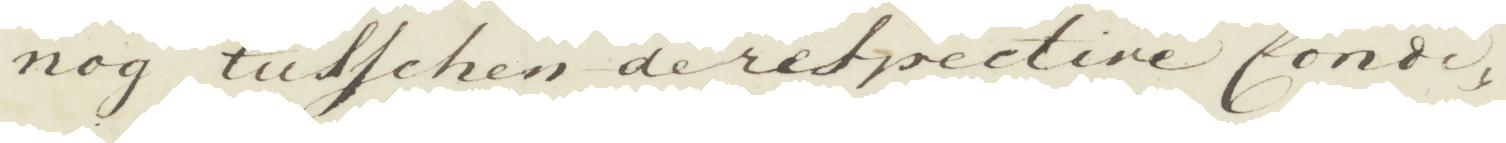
nog tusschen de respective Condi
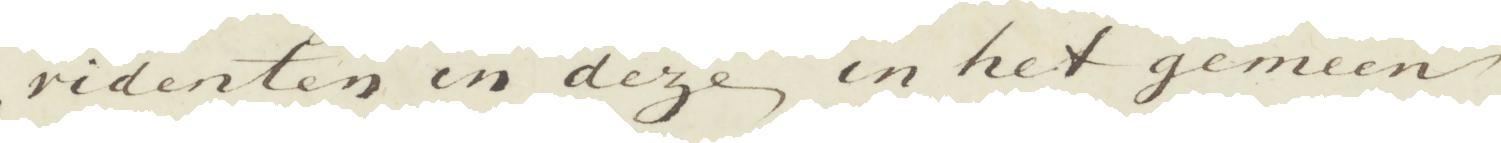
videnten in deze in het gemeen
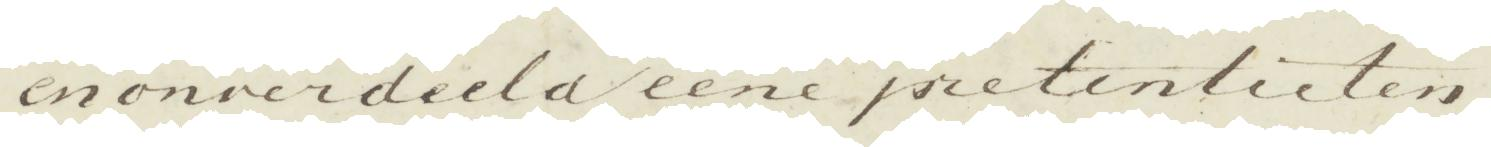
en onverdeeld eene pretentie ten
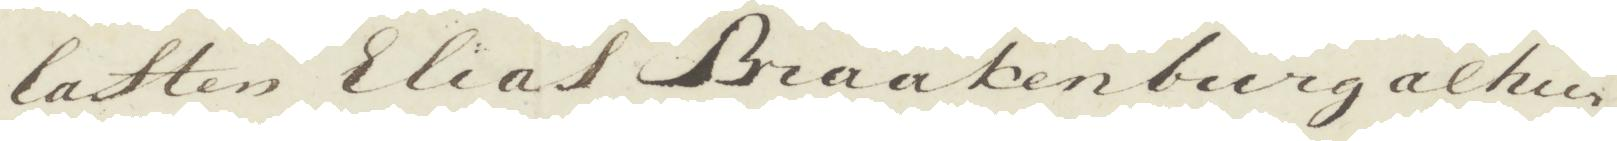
lasten Elias Braakenburg alhier
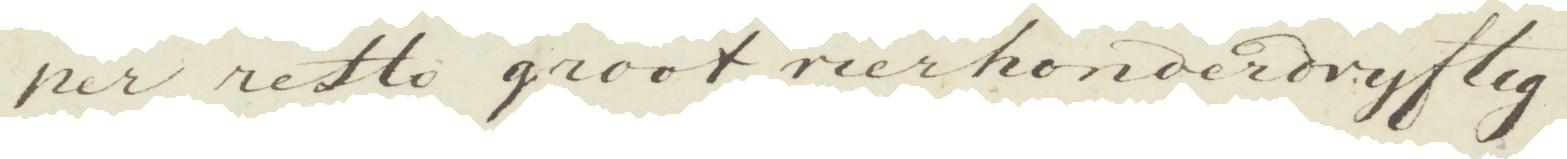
per resto groot vier honderd vyftig
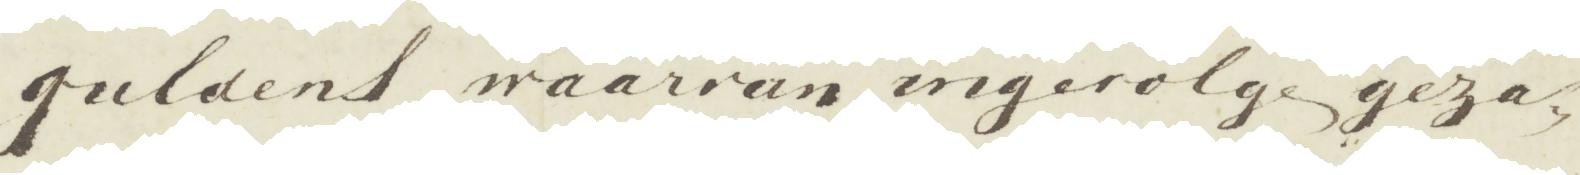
guldens waarvan ingevolge geza„
